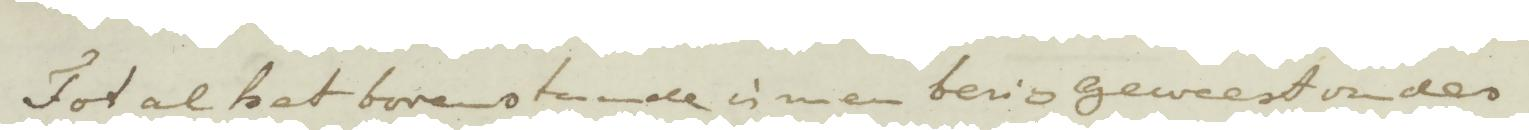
Tot al het bovenstaande is men bezig geweest van des
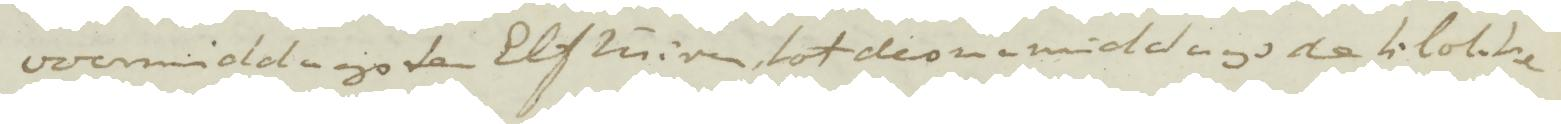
voormiddags ten Elf uuren, tot des namiddags de klokke
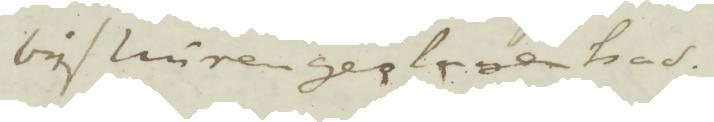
vijf uuren geslagen had.
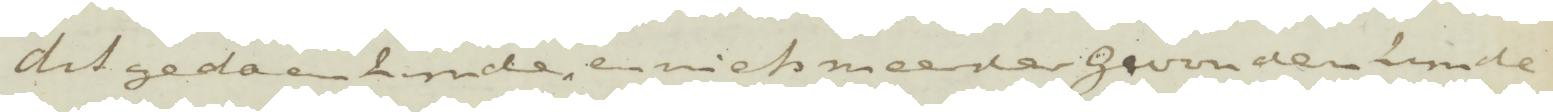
dit gedaan zynde, en niets meerder gevonden zynde
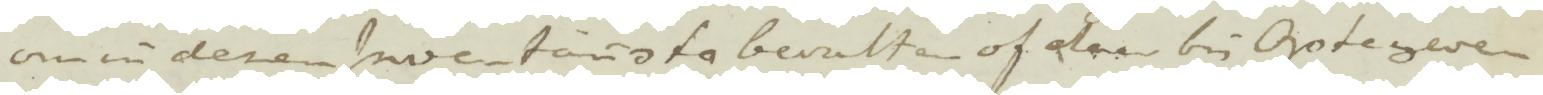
om in dezen Jnventaris te bevatten of daar bij optegeven
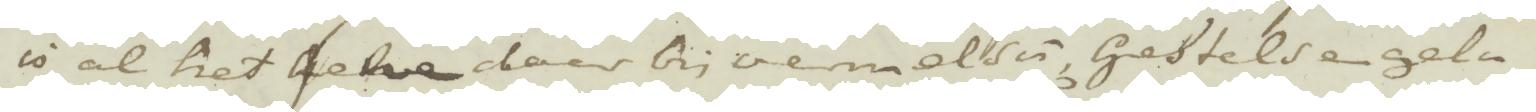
is al het zelve daar bij vermeld is, Gesteld en gela
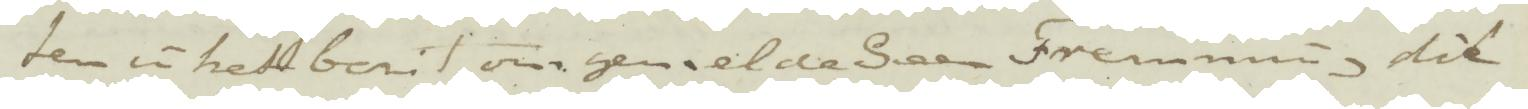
ten in het bezit van gemelde heer Fremming die
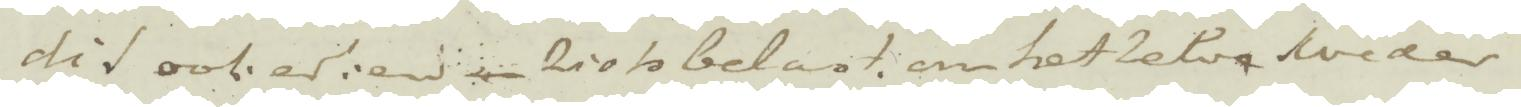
dit ook erkend en zich belast, om het zelve weder
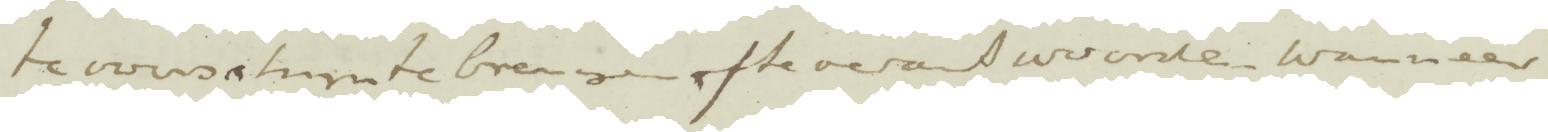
te voorschyn te brengen of te verantwoorden wanneer
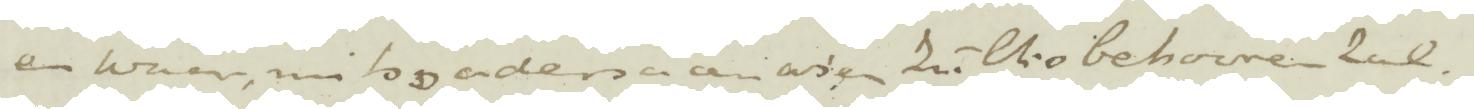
en waar, mitsgaders aan zulks behooren zal.
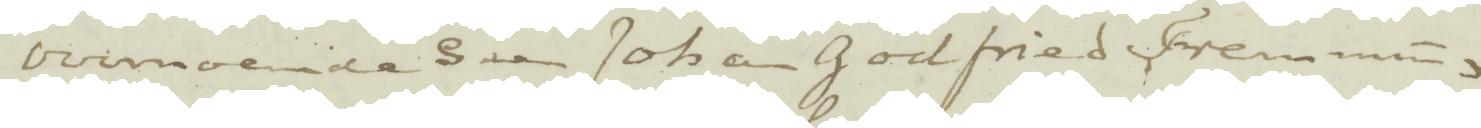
voornoemde heer Johan Godfried Fremming
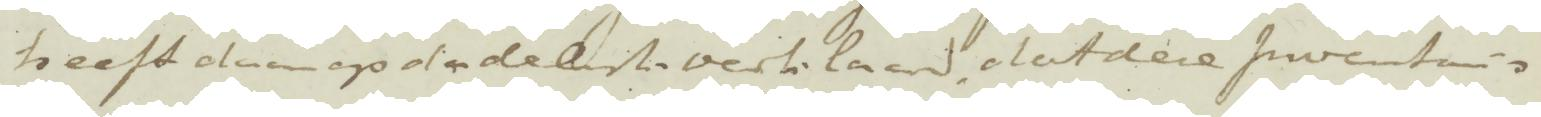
heeft daar op dadelyk verklaard, dat deze Jnventaris
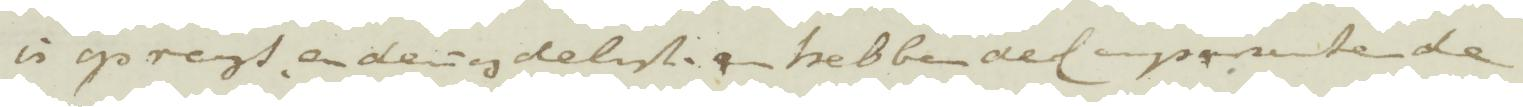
is opregt, en deugdelyk en hebben de Comparanten de
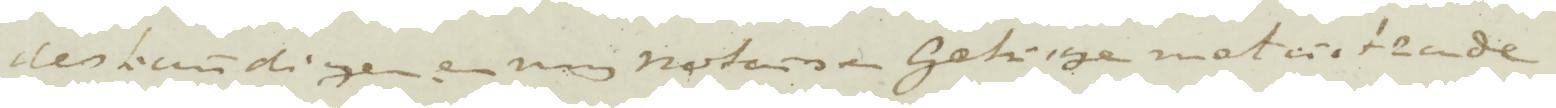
deskundigen, en my notaris en Getuige met uitzonde
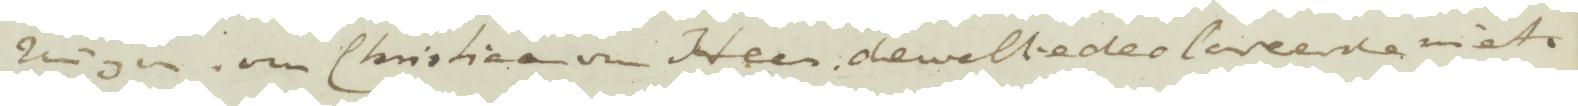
ringe, van Christiaan van Hees, dewelke declareerde niet
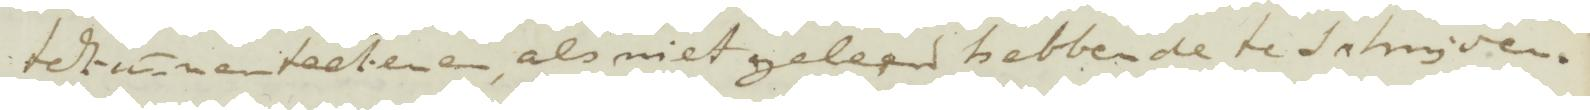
te kunnen teekenen, als niet geleerd hebbende te schrijven.
